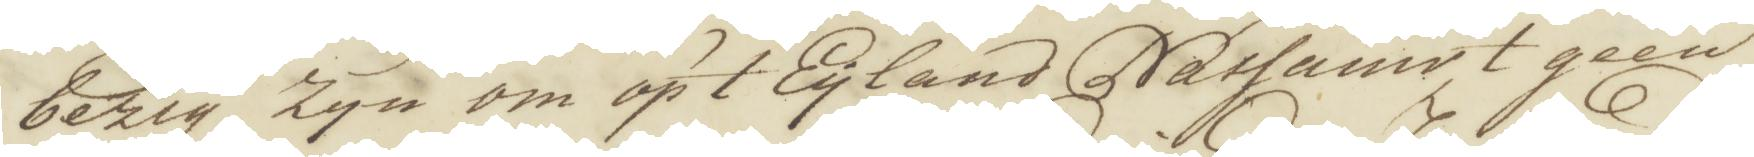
bezig zijn om op ’t Eijland Nassauw 't geen
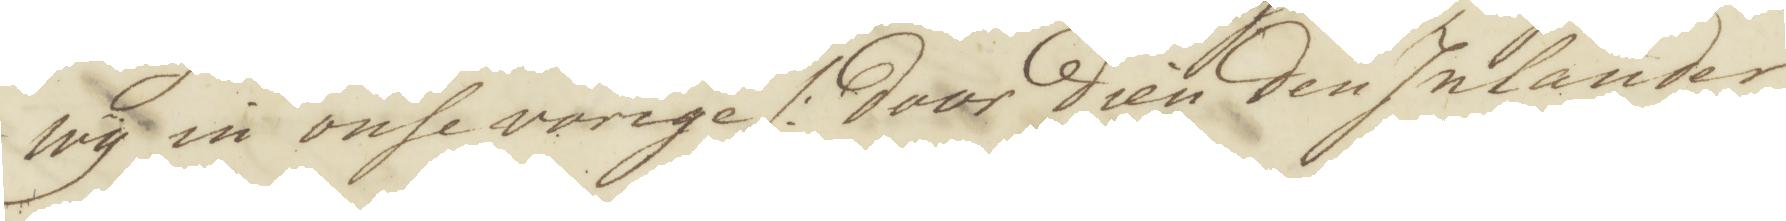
wij in onse vorige /: door dien den Jnlander
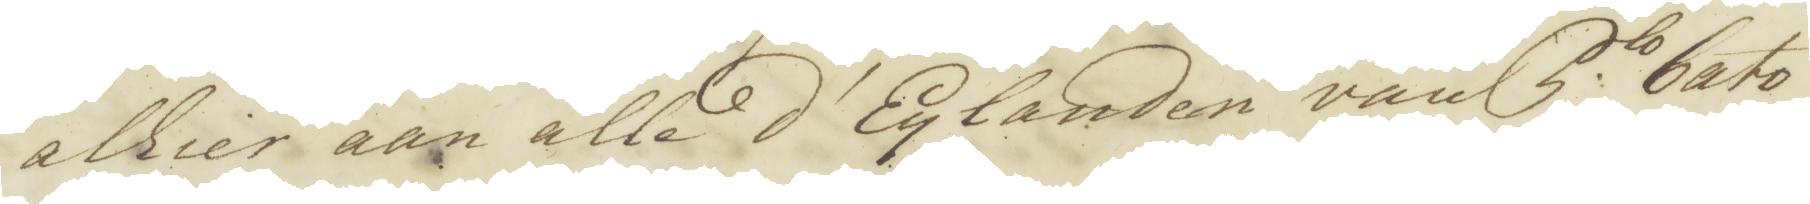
alhier aan alle d’Eylanden van P:lo bato
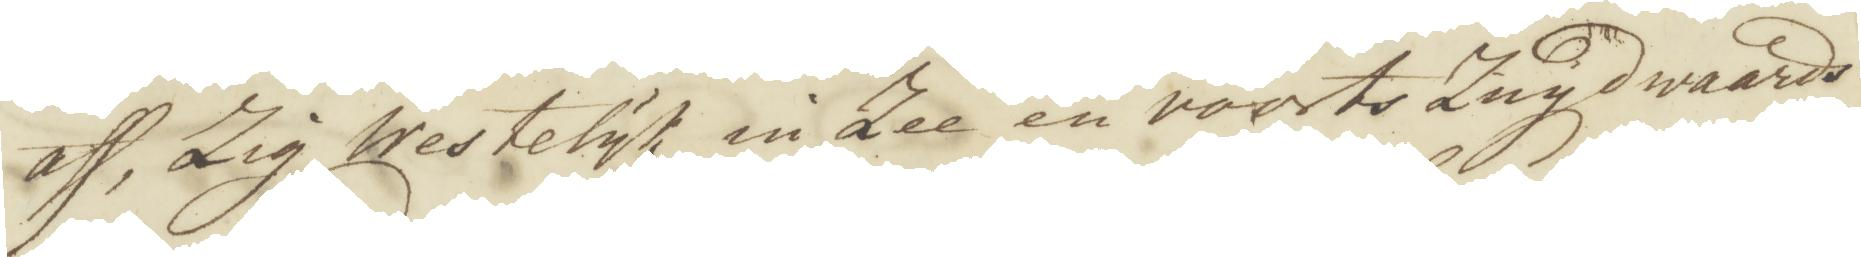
off, zig westelijk in zee en voorts zuijdwaards
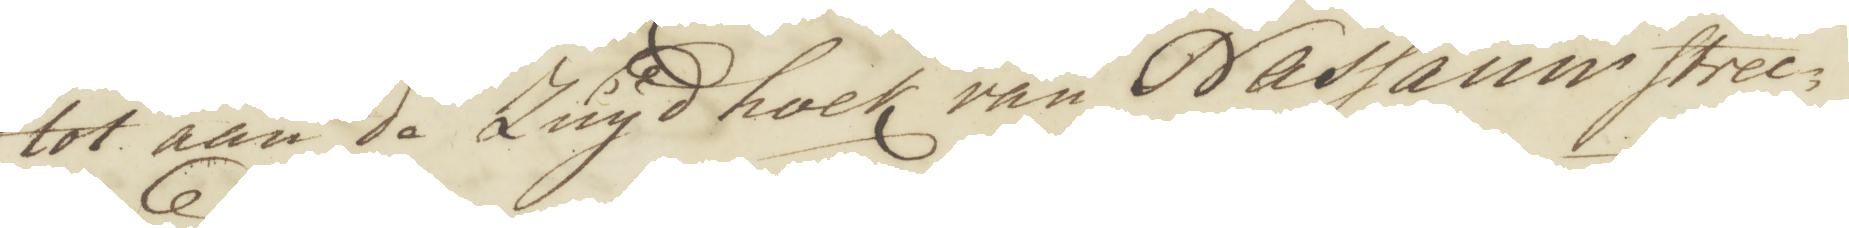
tot aan de zuijdhoek van Nassauw strec„
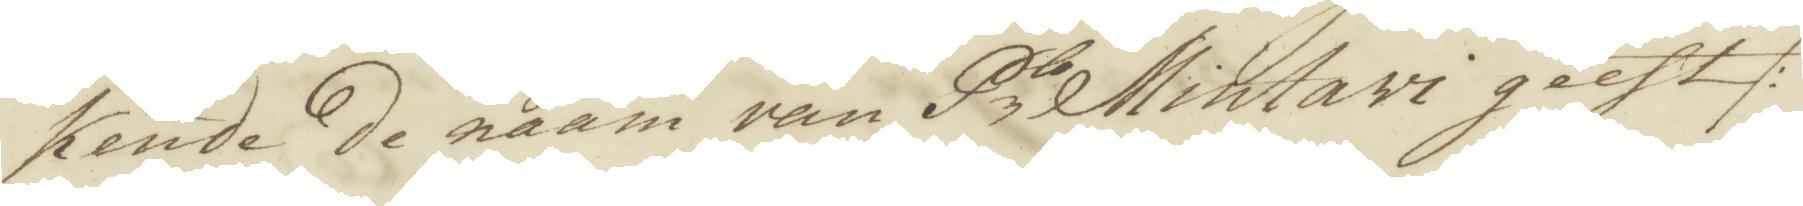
kende de naam van P„lo Mintavi geest /:
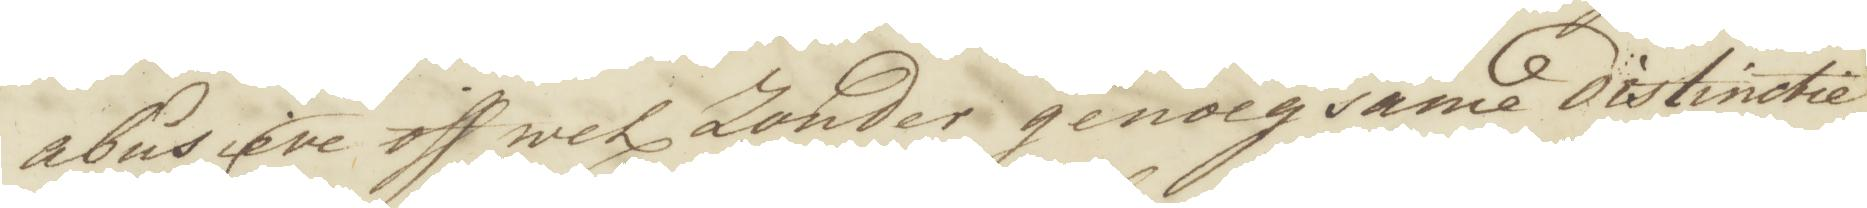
abusieve off wel zonder genoegsame distinctie
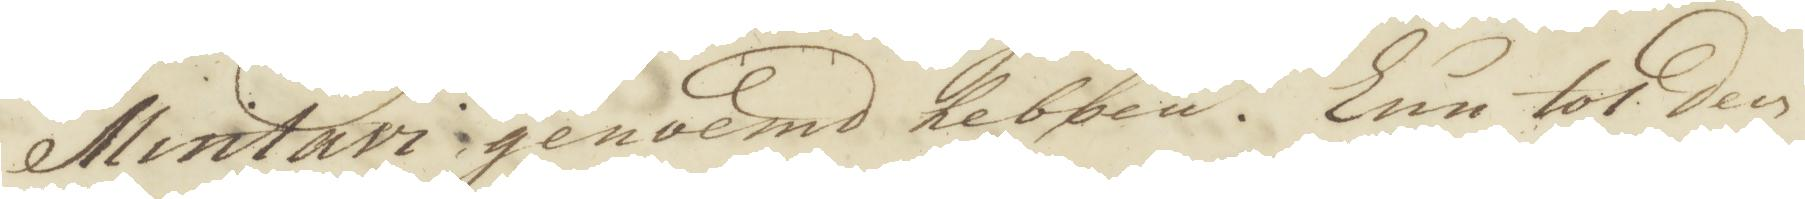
Mintavi genoemd hebben. hun tot den
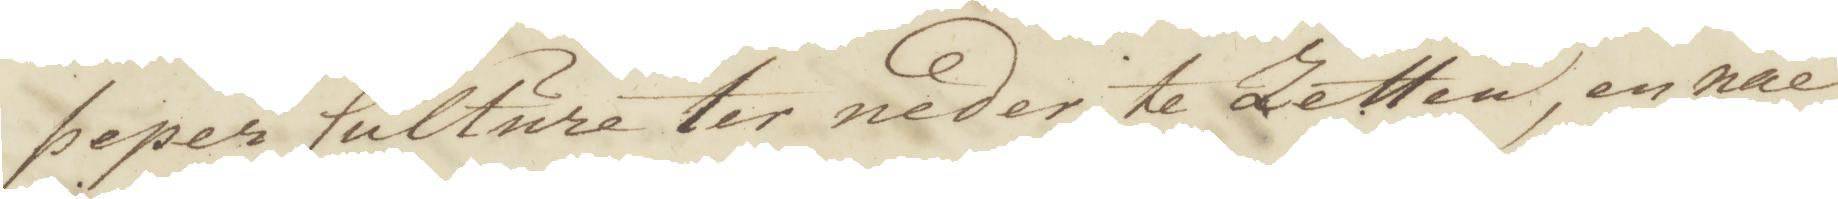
peper Culture ter neder te zetten, en nae
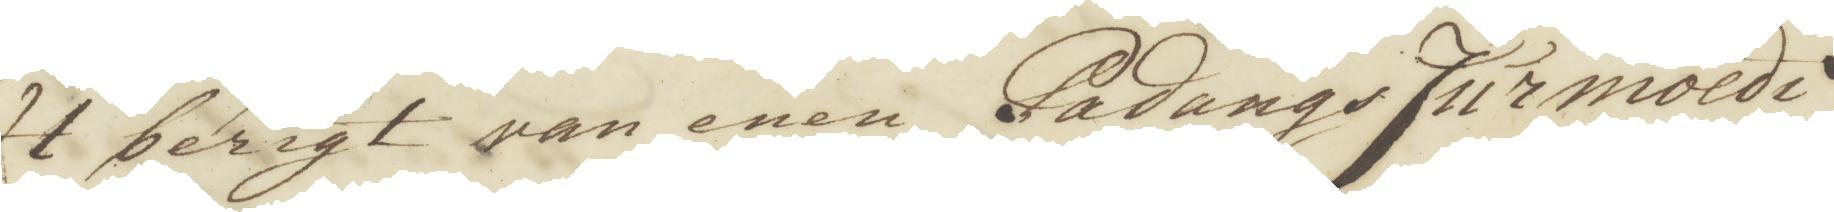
't berigt van enen Padangs Jurmoedi
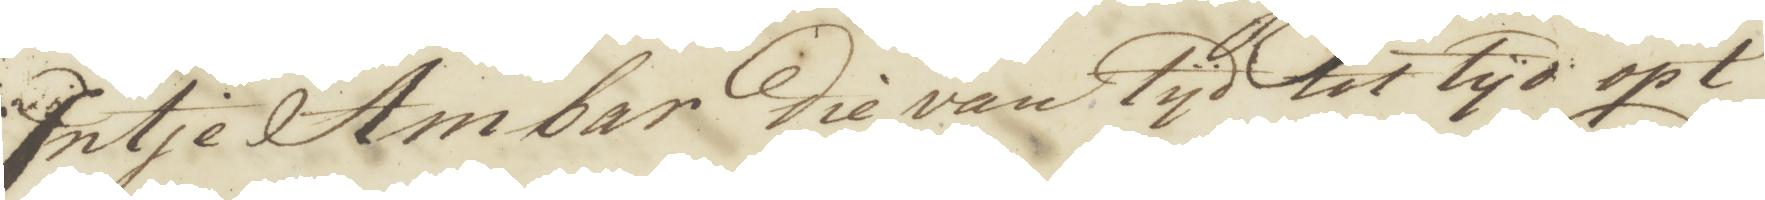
Jntje Ambar die van tijd tot tijd op 't
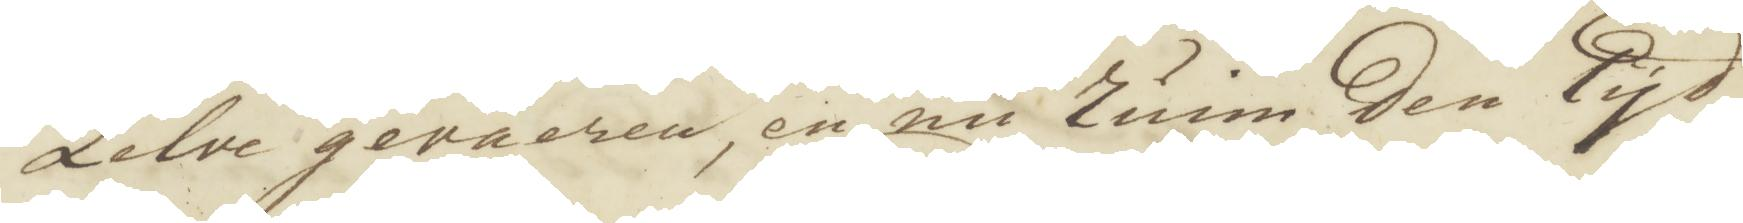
zelve gevaeren, en nu ruim den tijd
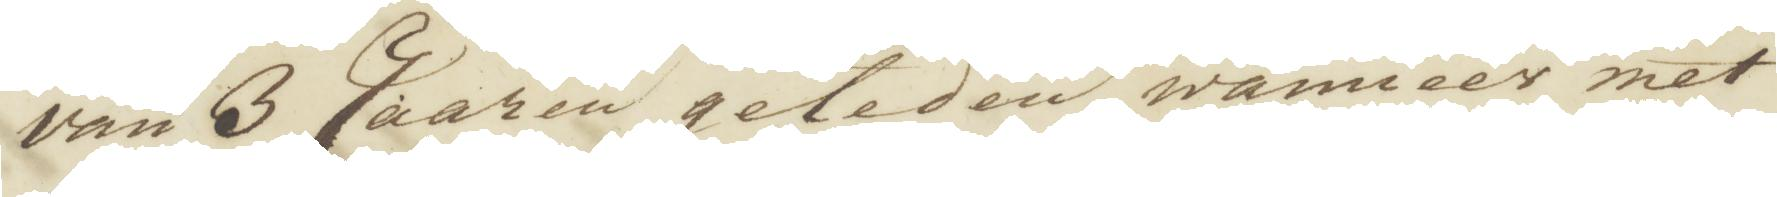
van 3 Jaaren geleden, wanneer met
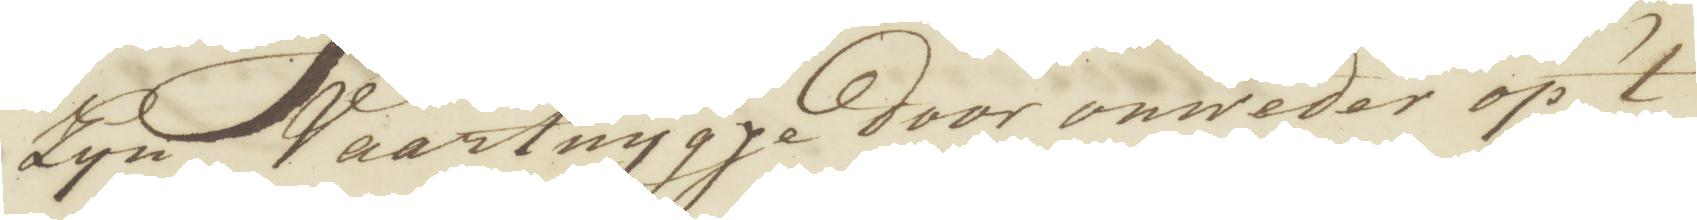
zyn Vaartuijgje door onweder op ’t
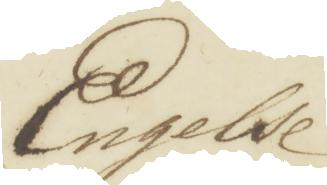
Engelse
